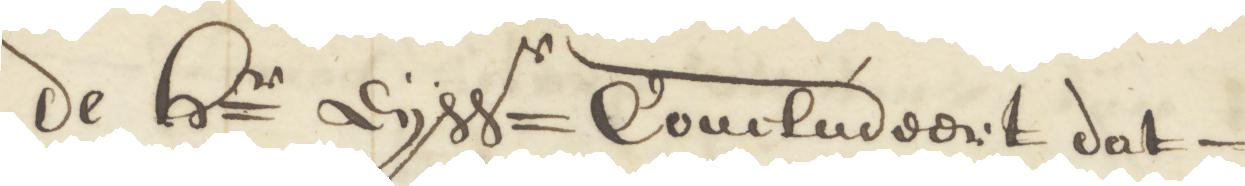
de H=r Eijss=r Concludeert dat —
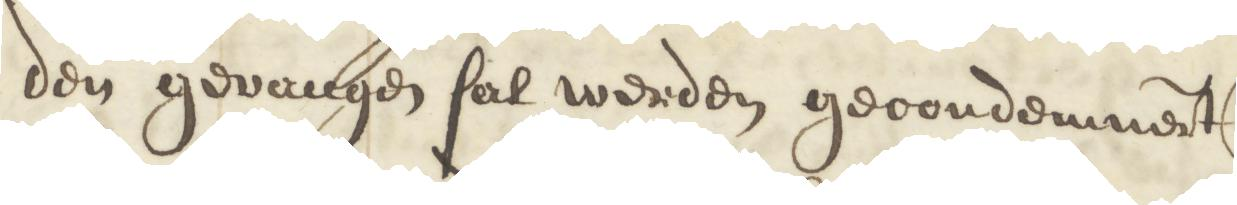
den gevangen sal werden gecondemnert
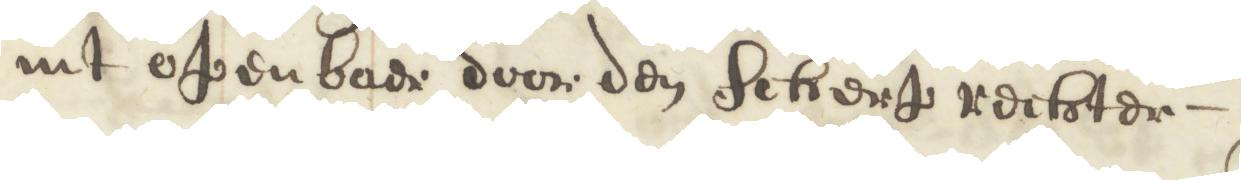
in’t openbaer door den scherp rechter —
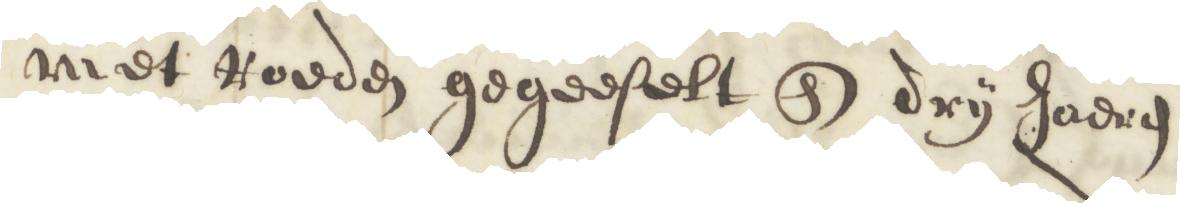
met roeden gegeeselt ende drij Jaeren
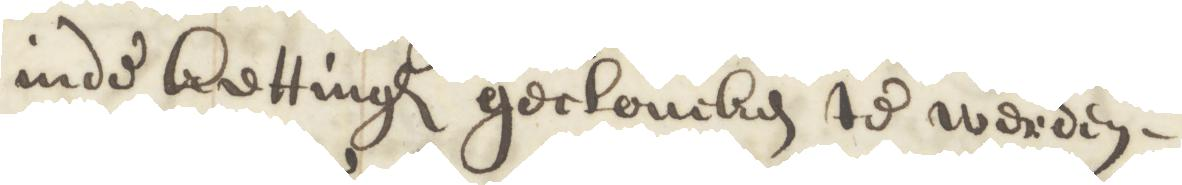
inde kettingh gecloncken te werden —
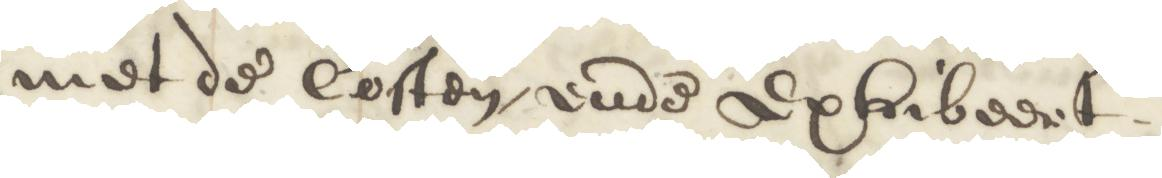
met de Costen, ende Exhibeert —
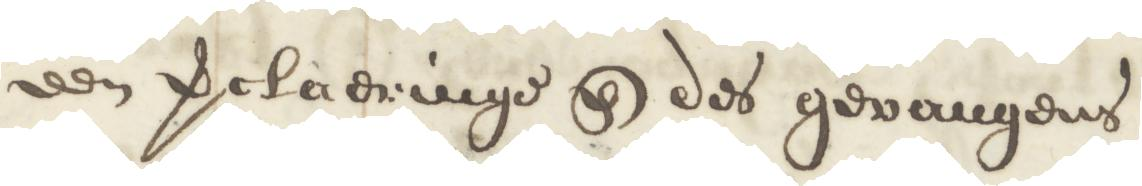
een verclaeringe ende des gevangens
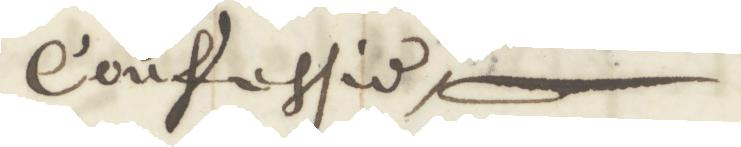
Confessie, —
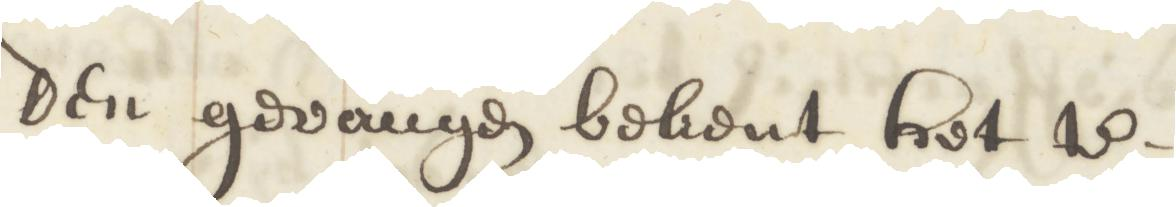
den gevangen bekent het te —
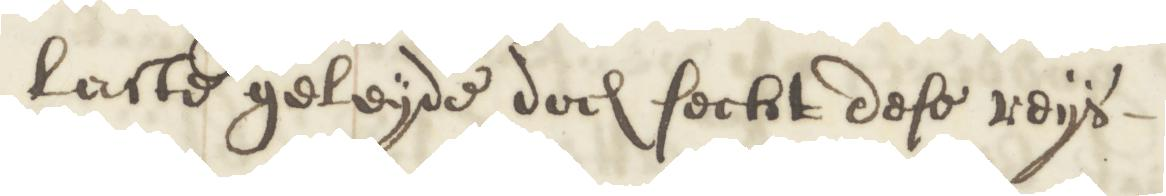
laste geleijde doch secht dese reijs —
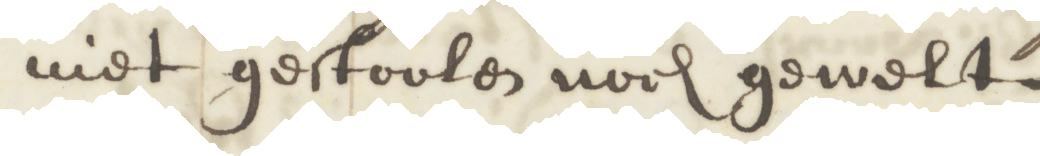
niet gestoolen noch gewelt
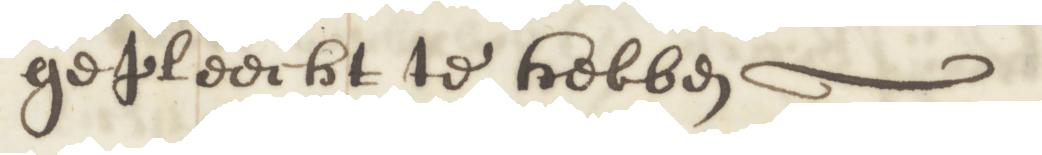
gepleecht te hebben —
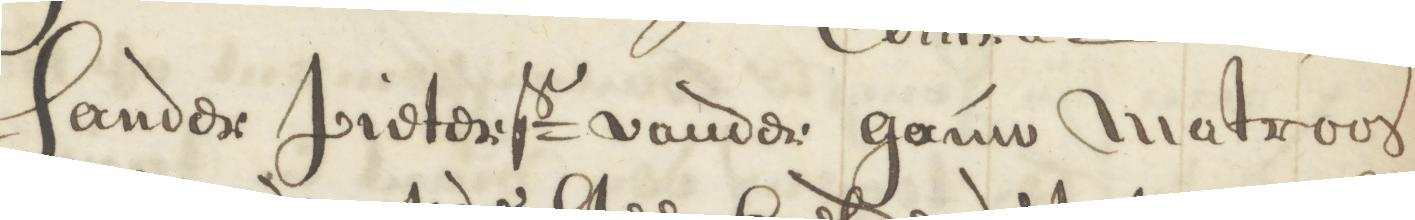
Sander Pieters=se vander gauw Matroos
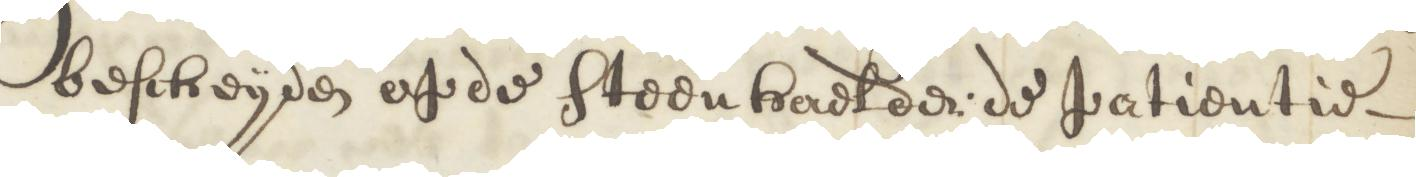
bescheijden op de steenhaelder de patientie —
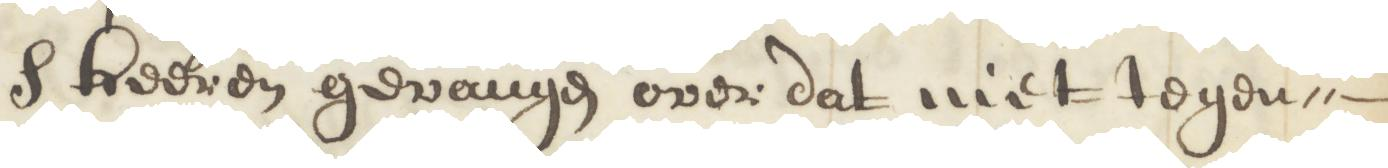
s heeren gevangen over dat niet tegen„
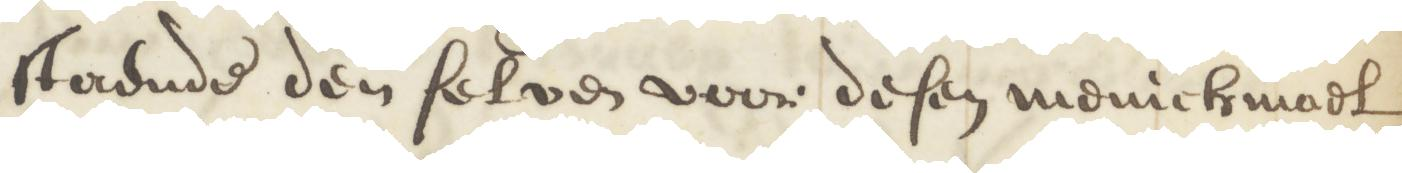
staende den selven voor desen menichmael
